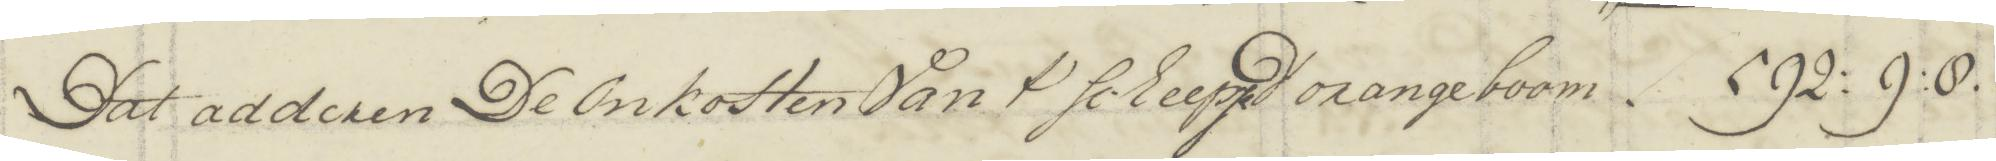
Dat adderen De Onkosten Van t scheepje d' orange boom. 592: 9:8.
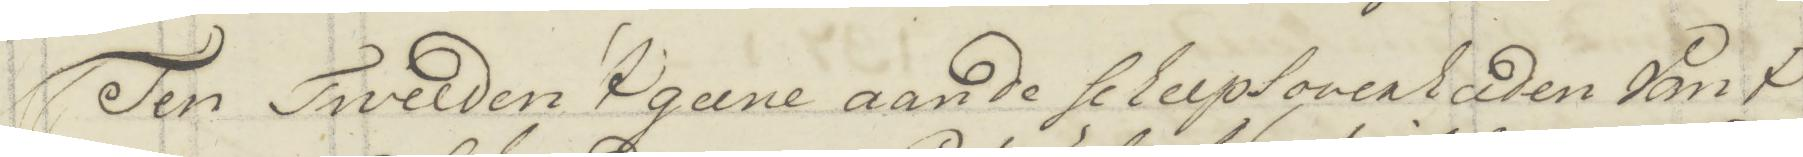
Ten Tweeden ’t geene aande scheepsoverheeden van t
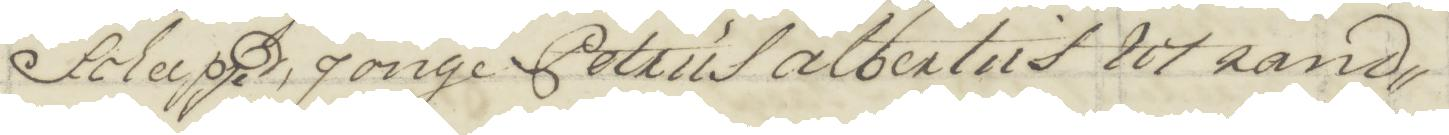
Scheepje, Jonge Petrus albertus tot rand„
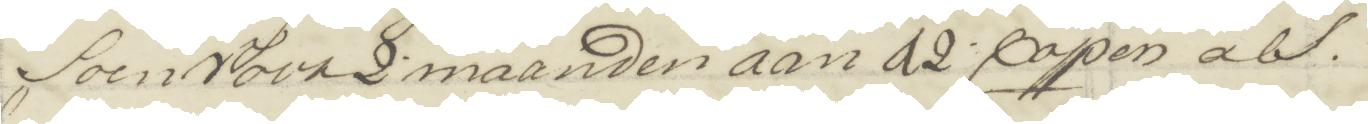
„soen voor 2 maanden aan 42 Coppen als.
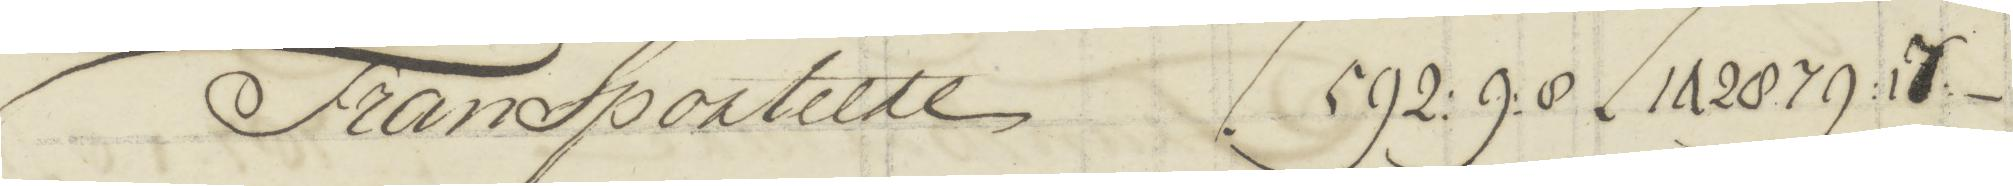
Transporteere ƒ 592: 9:8 ƒ142879:17:—
